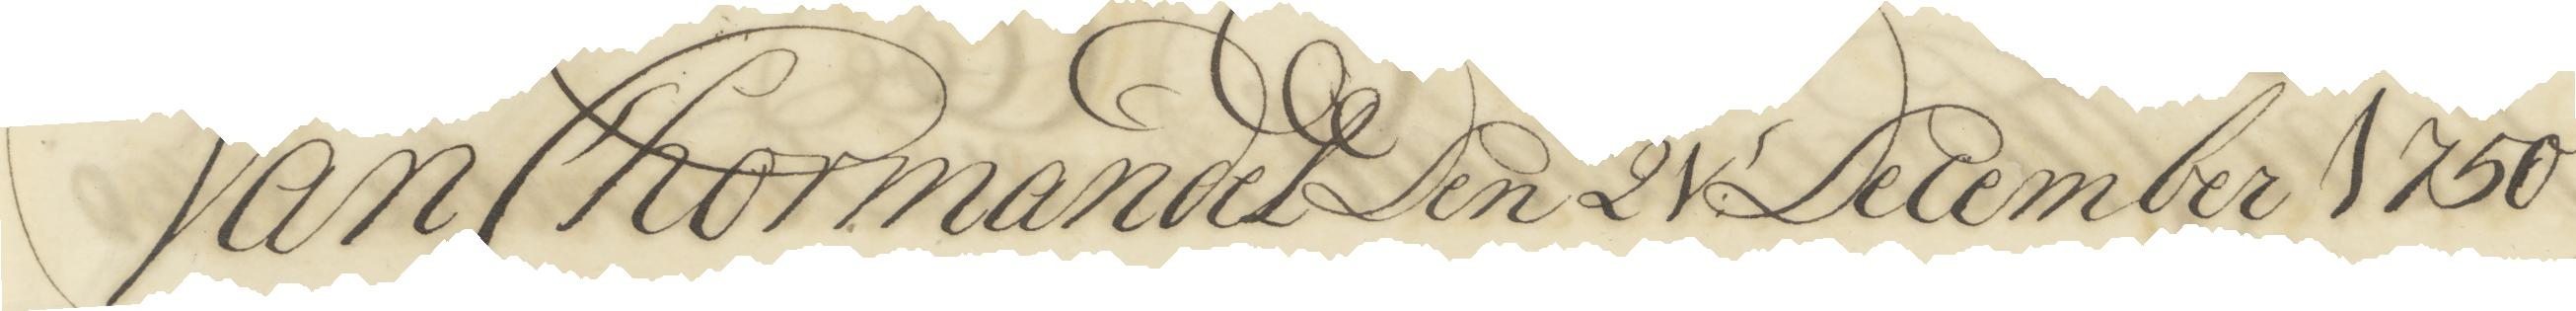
Van Chormandel Den 21:' December 1750
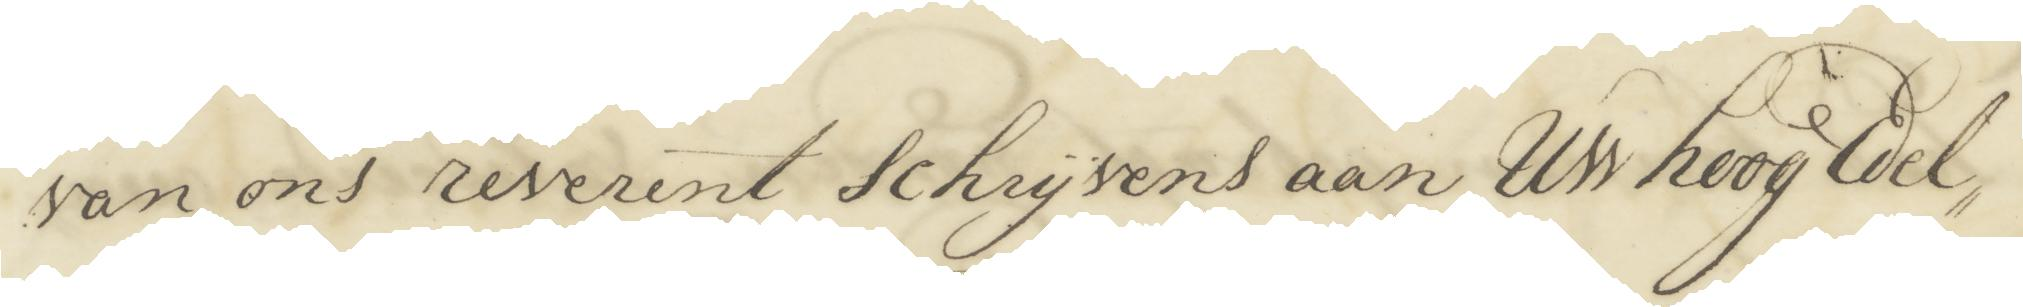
van ons reverent schrijvens aan UW hoog Edel„
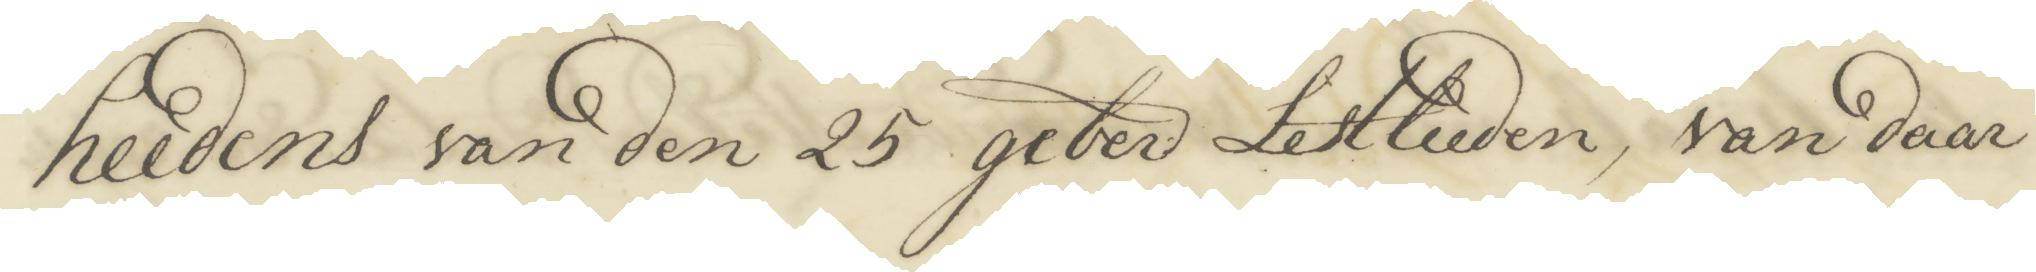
heedens van den 25 geber Lestleeden, van daar
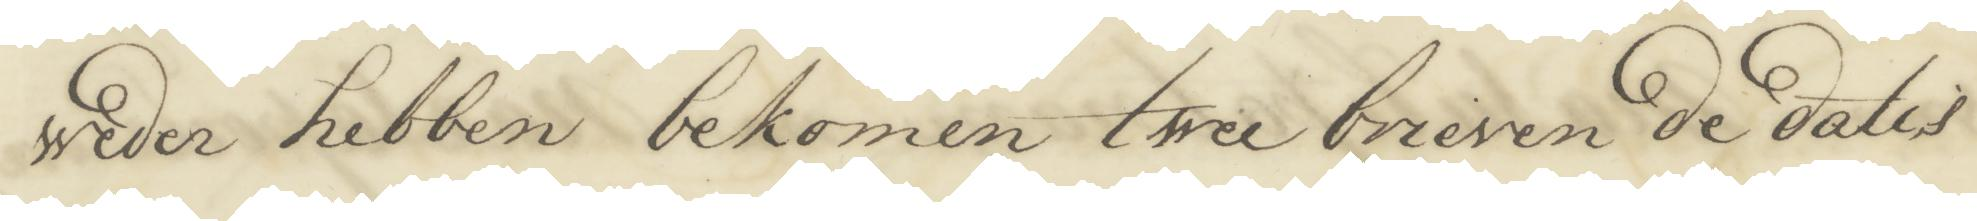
weder hebben bekomen twee brieven de datis
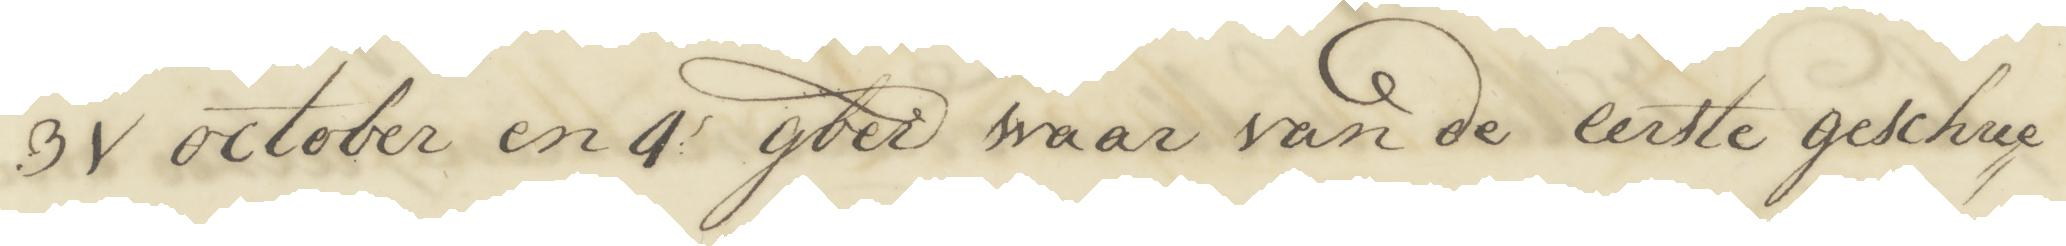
31 october en 4:en gber waar van de eerste geschree„
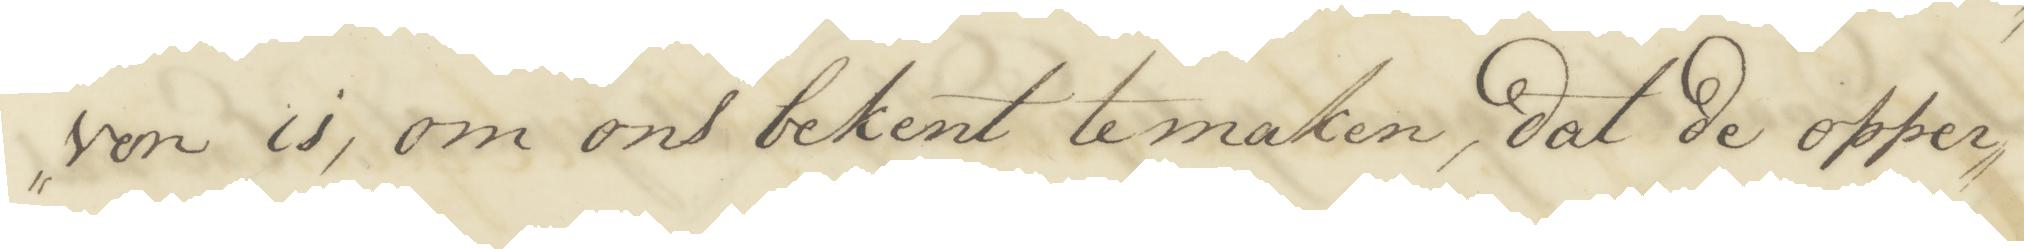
„ven is, om ons bekent temaken, dat de opper„
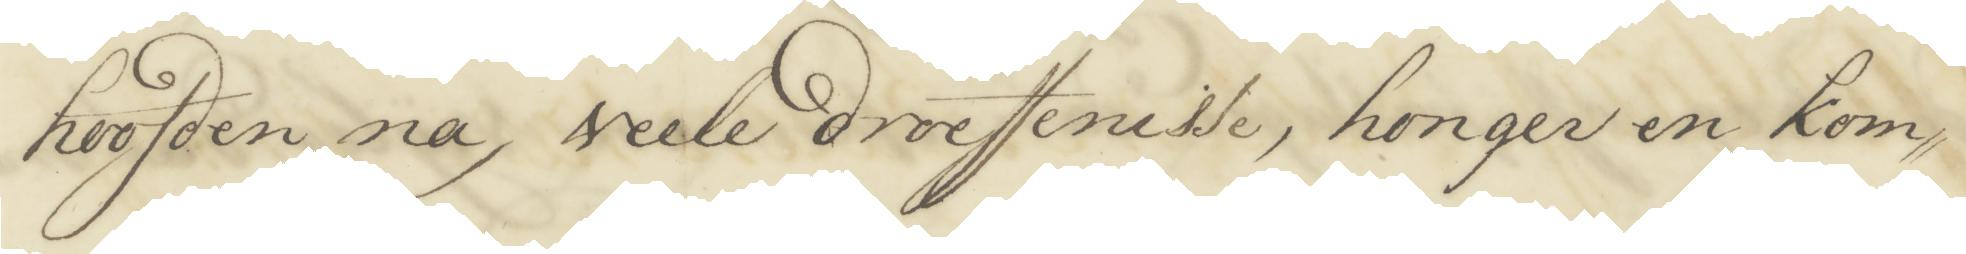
hoofden na, veele droeffenisse, honger en kom„
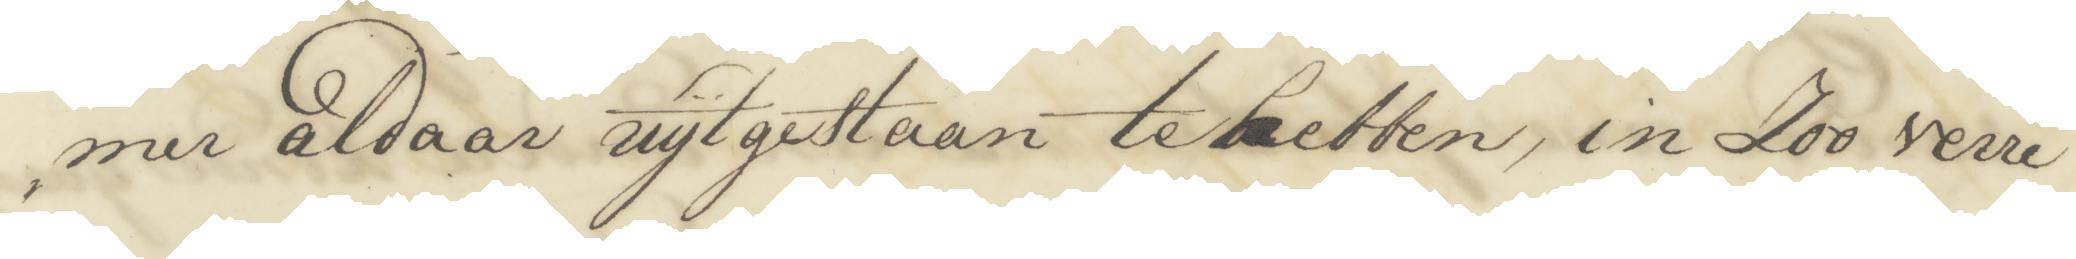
„mer aldaar uijtgestaan te hebben, in zoo verre
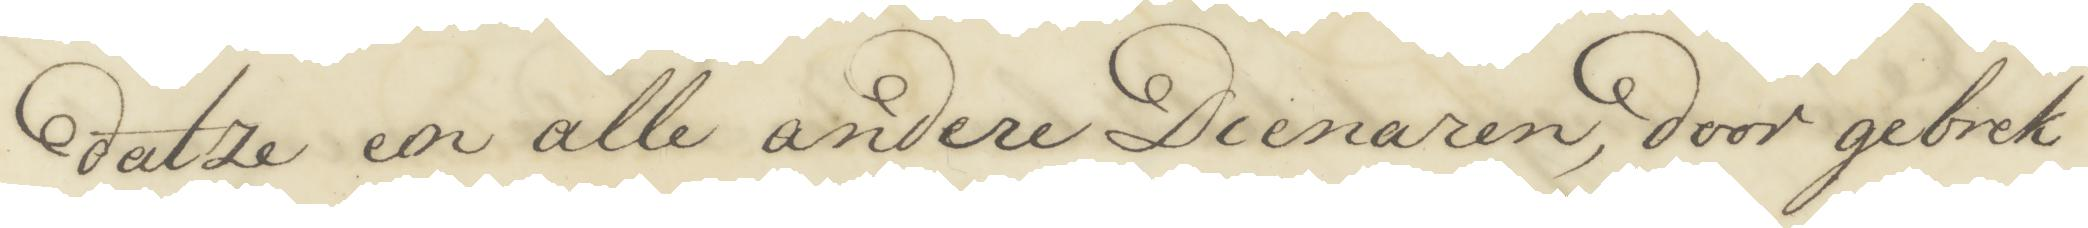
dat ze en alle andere Dienaren, door gebrek
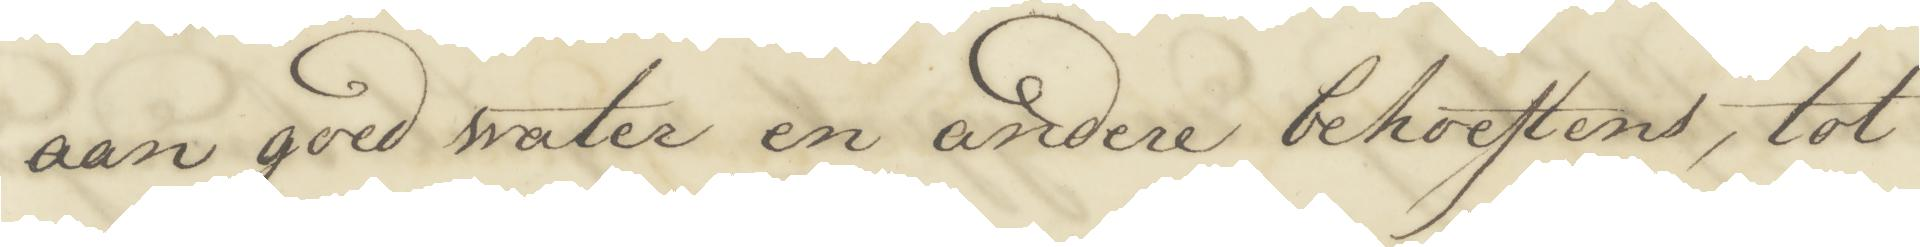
aan goed water en andere behoeftens, tot
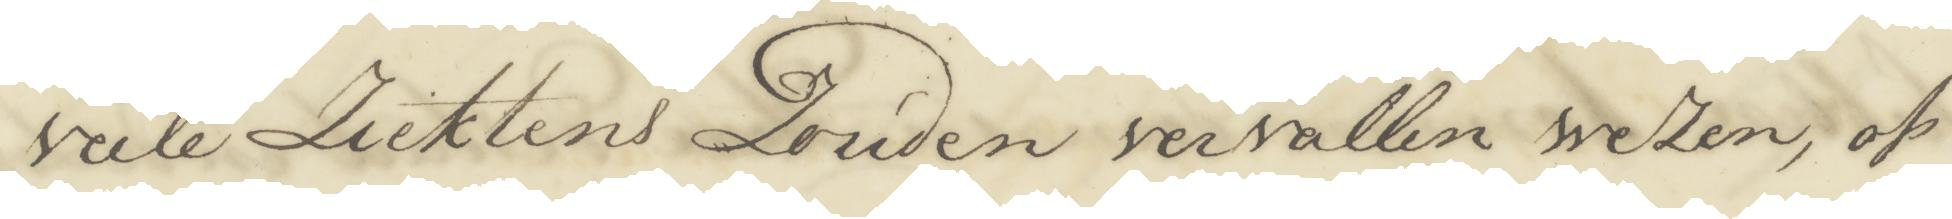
veele ziektens zouden vervallen wezen, op
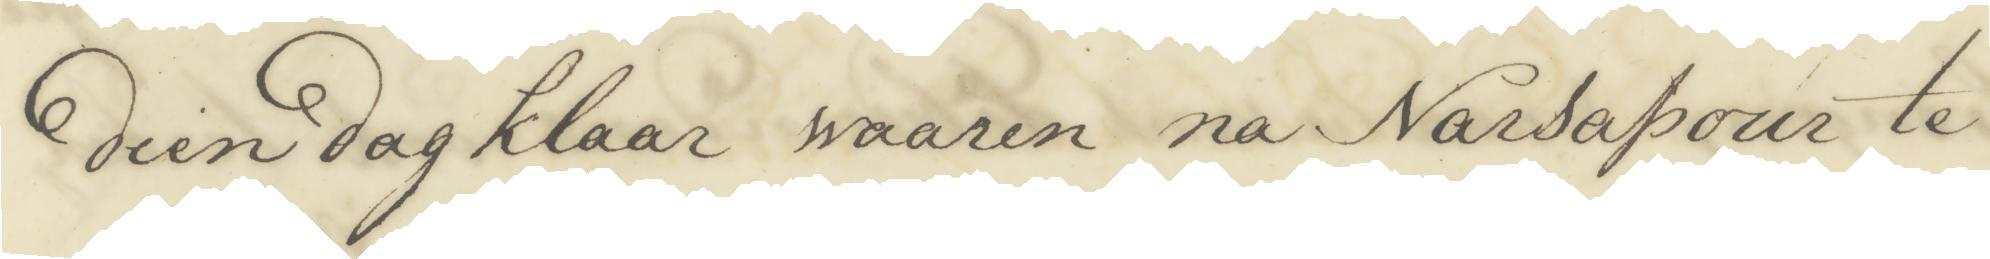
dien dag klaar waaren na Narsapour te
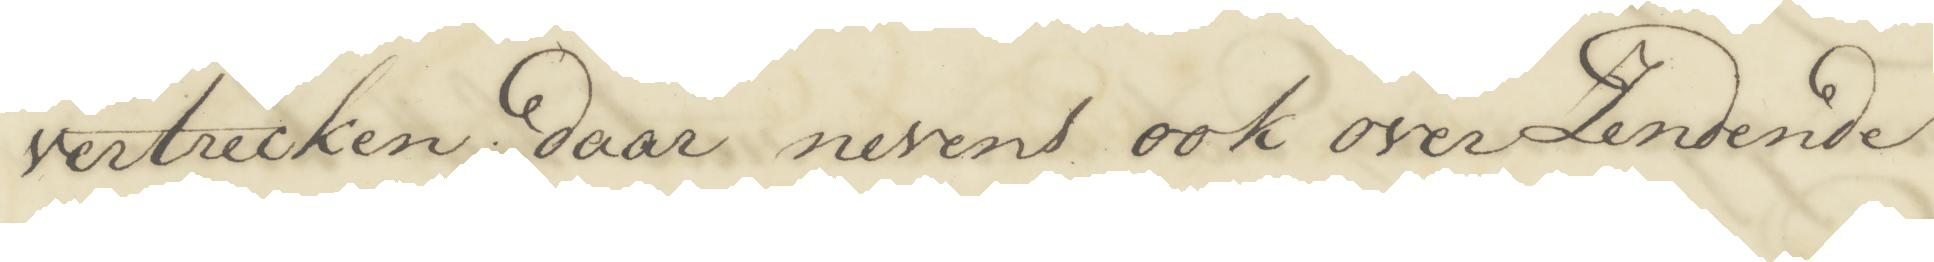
vertrecken, daar nevens ook over zendende
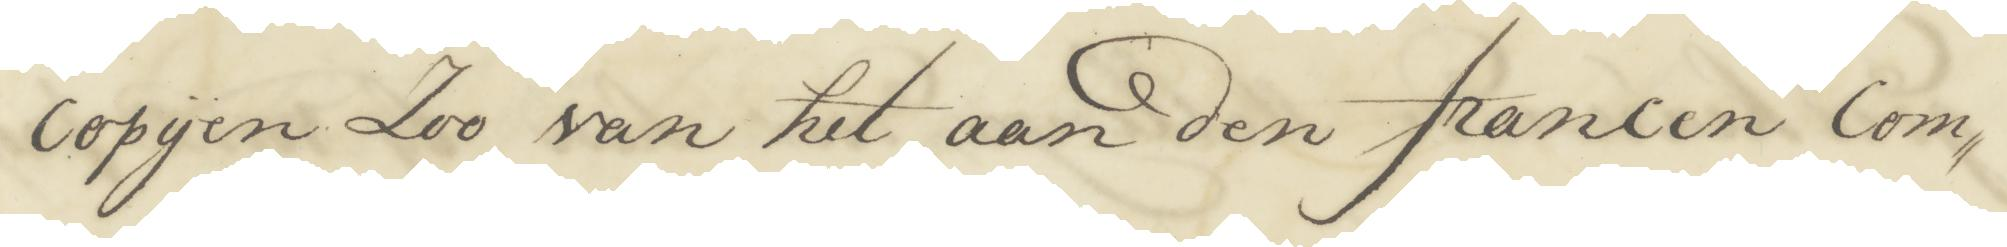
copijen zoo van het aan den francen Com„
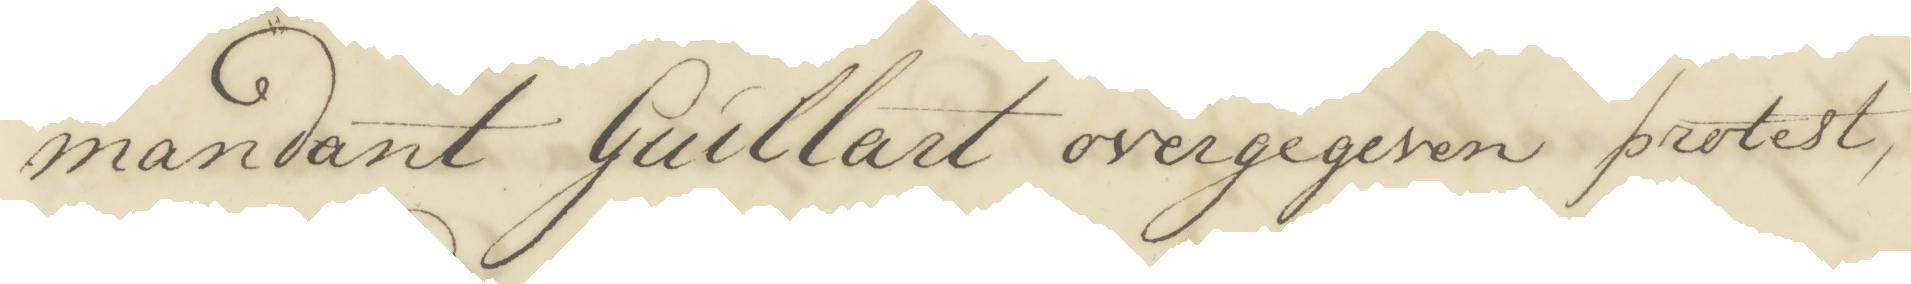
mandant Guillart overgegeven protest,
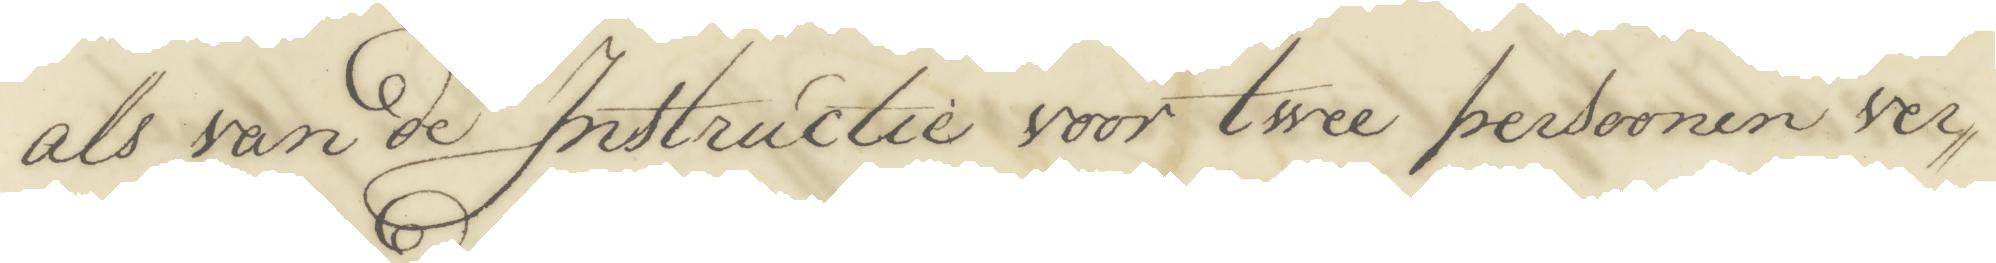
als van de Jnstructie voor twee persoonen ver„
